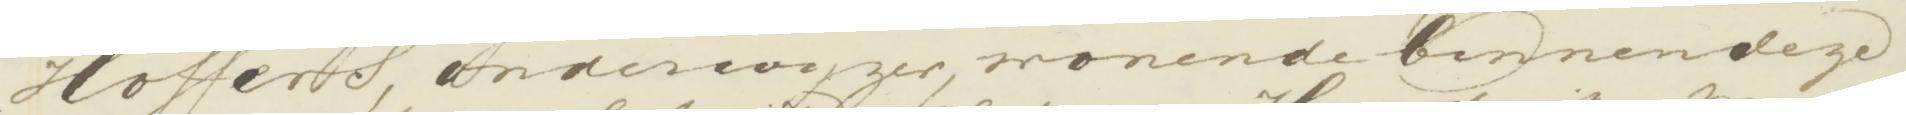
Hoffers onderwyzer, wonende binnen deze
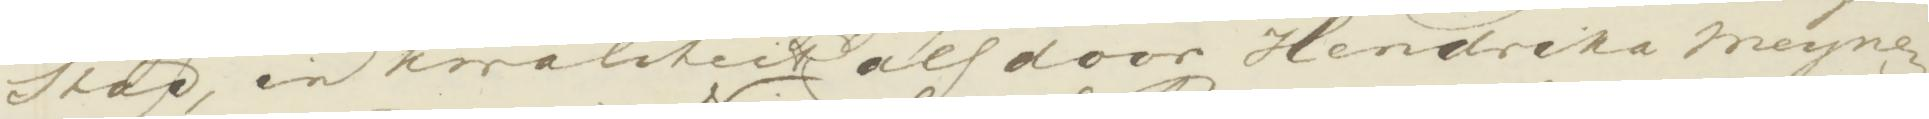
stad, in kwaliteit als door Hendrika Meynen
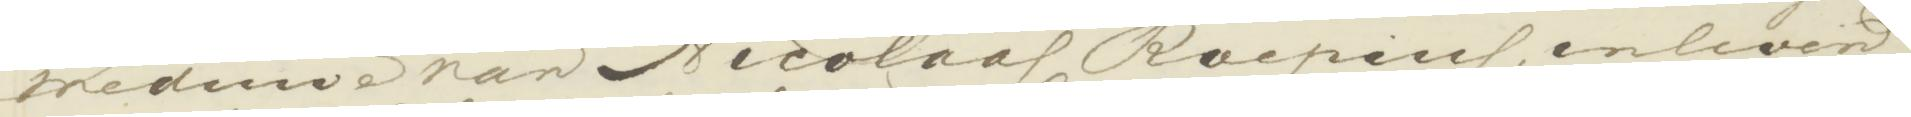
weduwe van Nicolaas Roepius, in leven
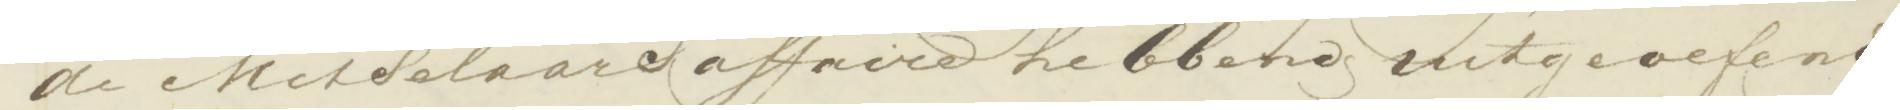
de Metselaarsaffaire hebbende uitgeoefend
